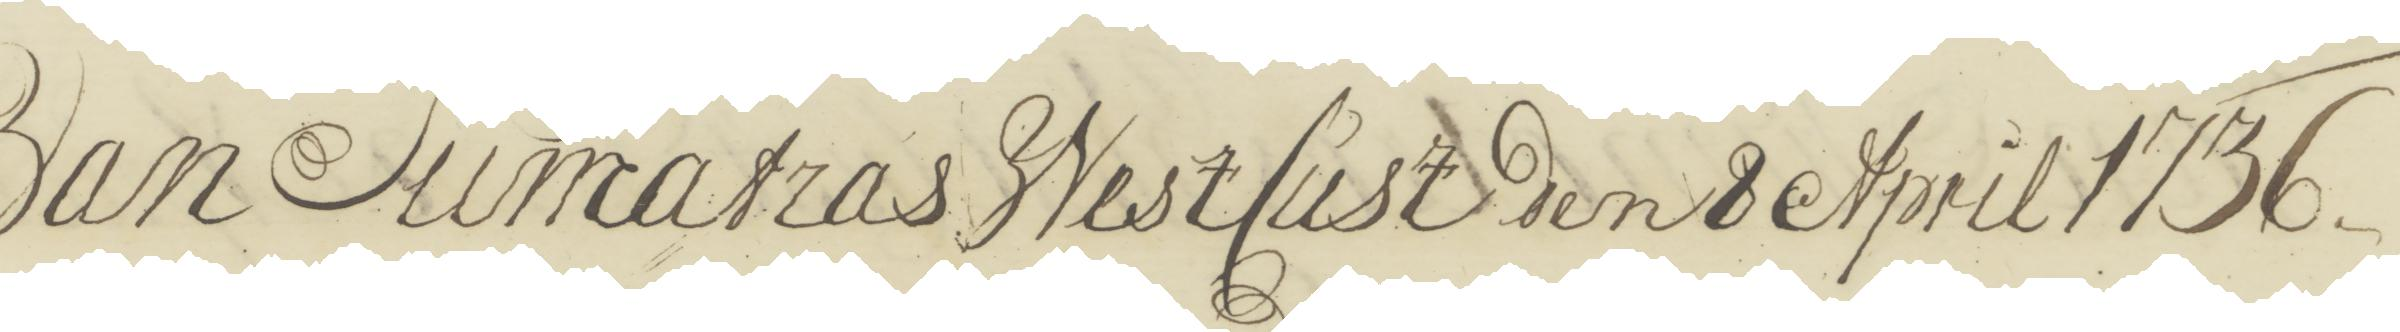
Van Sumatras West Cust den 8 April 1736.
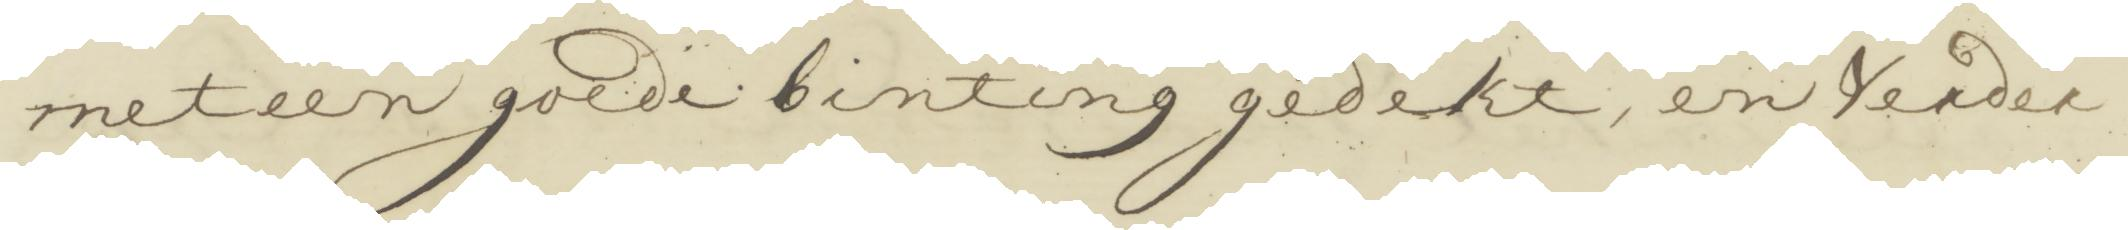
met een goede binting gedekt, en verder
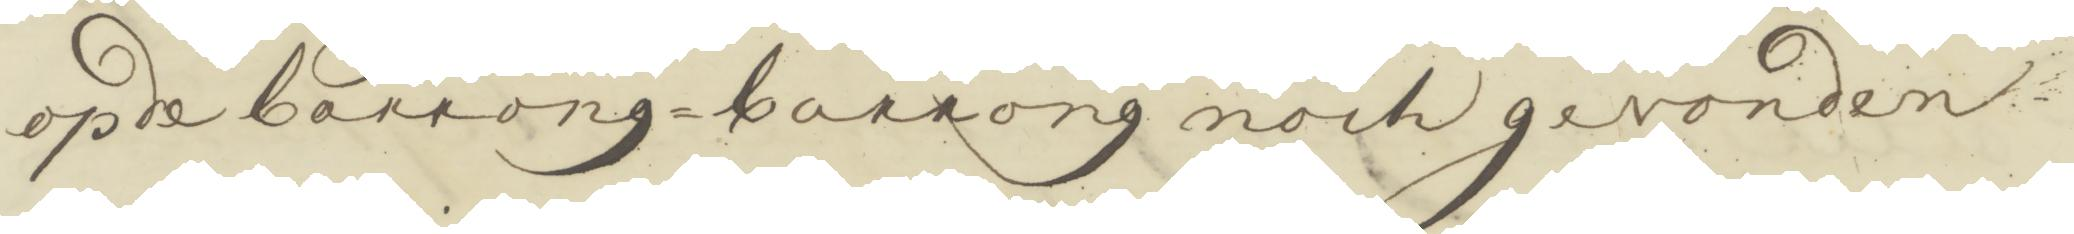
op de barrong-barrong noch gevonden.
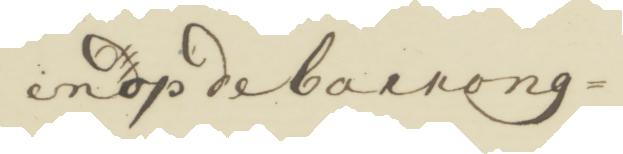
en op de barrong=
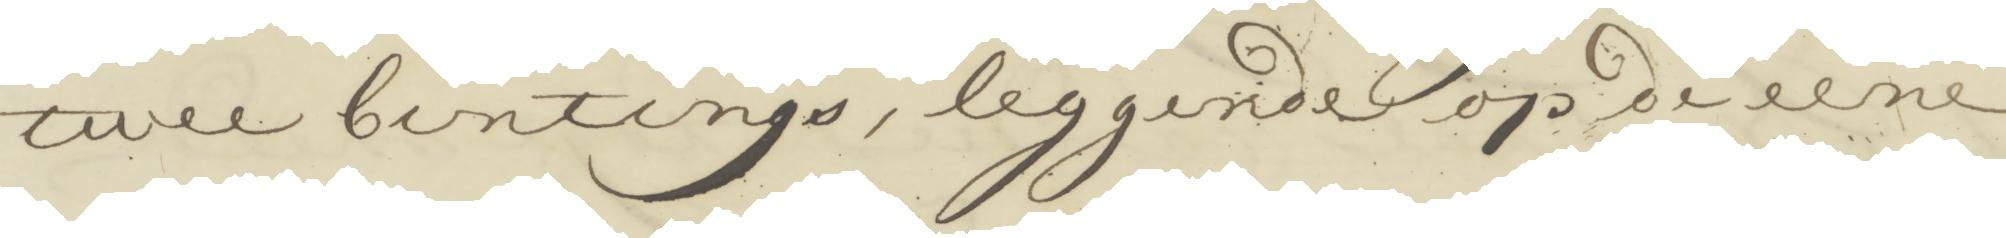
twee bintings, leggende op de eene
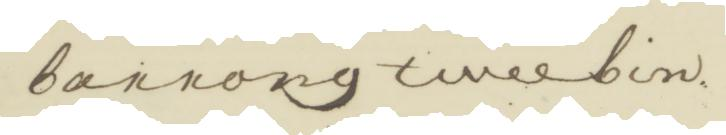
barrong twee bin„
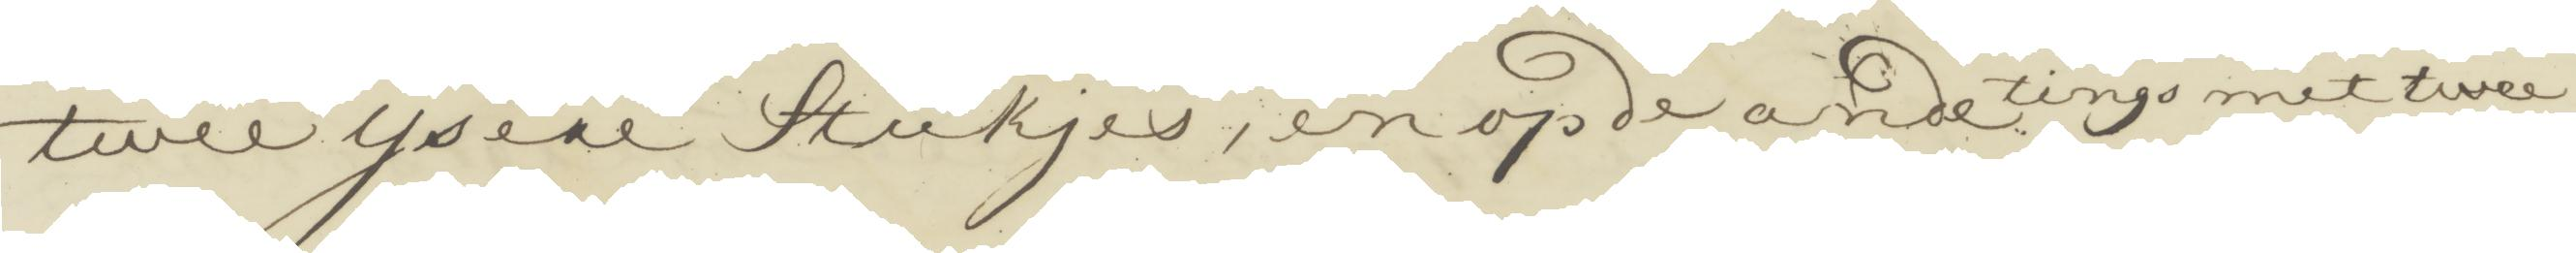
twee ijsere stukjes, en op de ande„ tings met twee
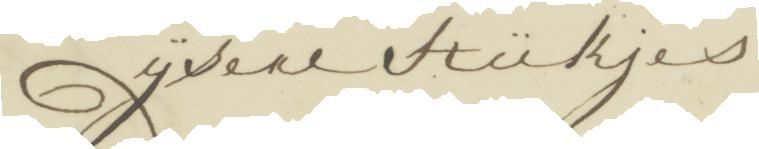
ijsere stukjes
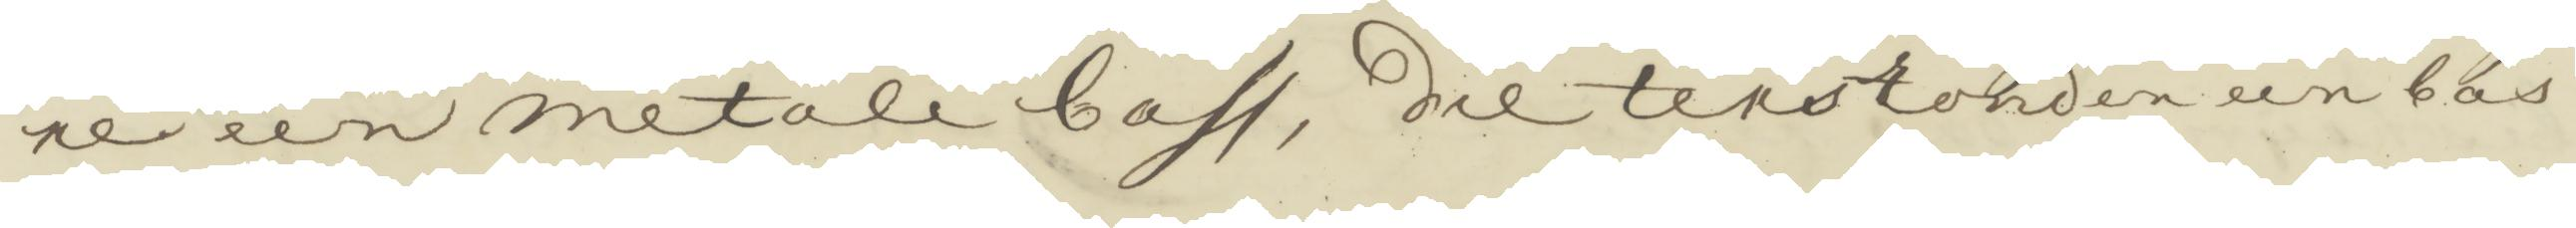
re een metale bast, die terstond en een bas
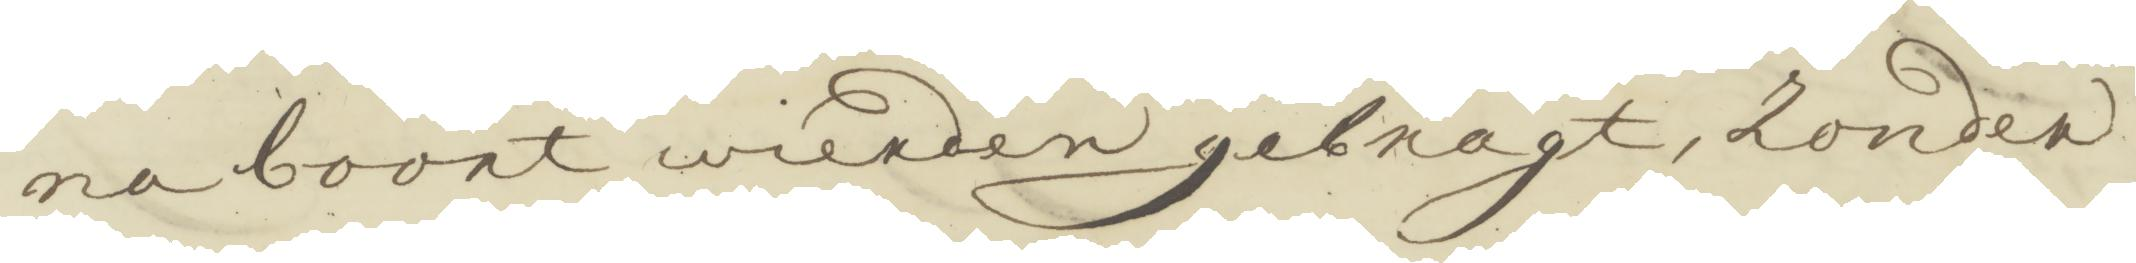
na boort wierden gebragt, zonder
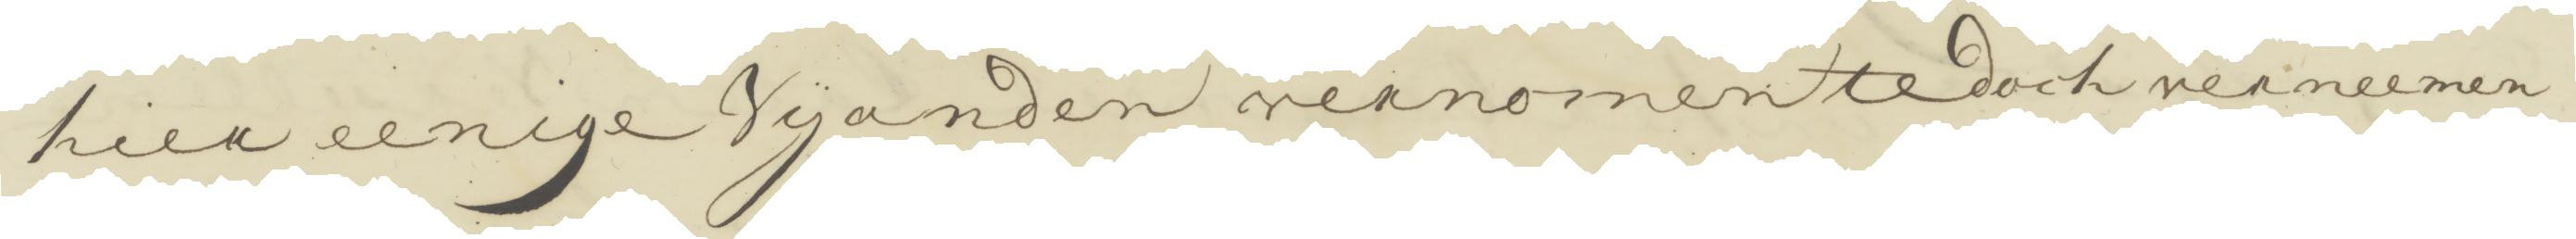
hier eenige vijanden vernomen te doch verneemen
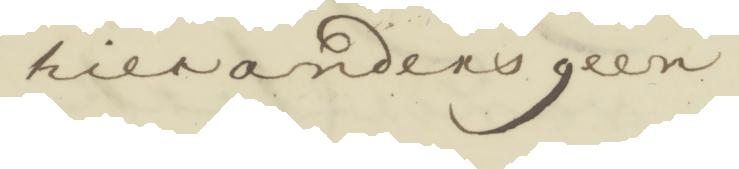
hier anders geen
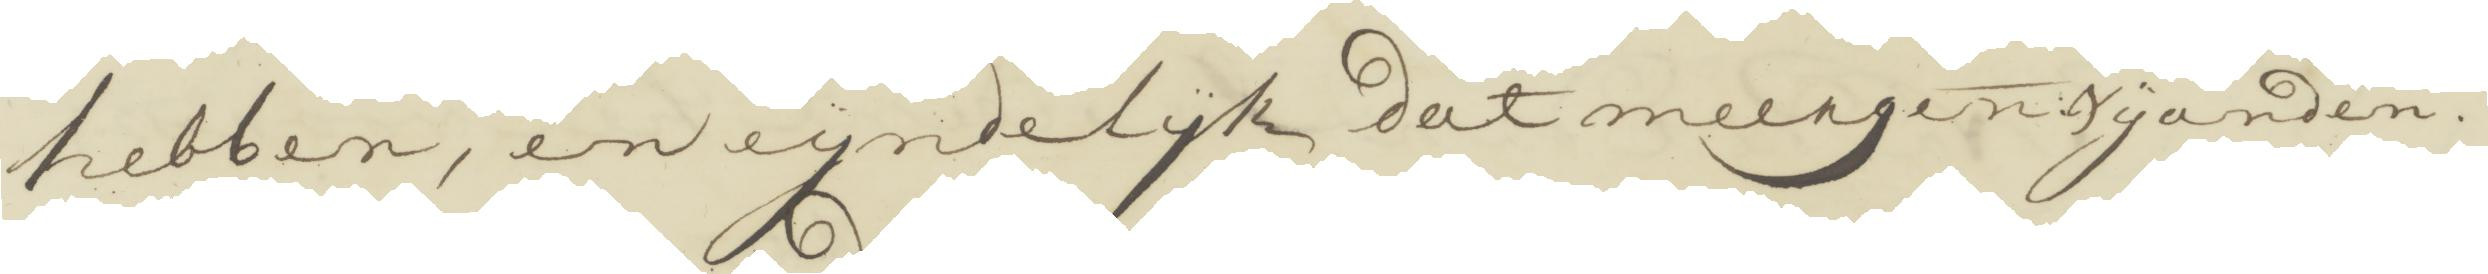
hebben, en eijndelijk dat meergen: vijanden
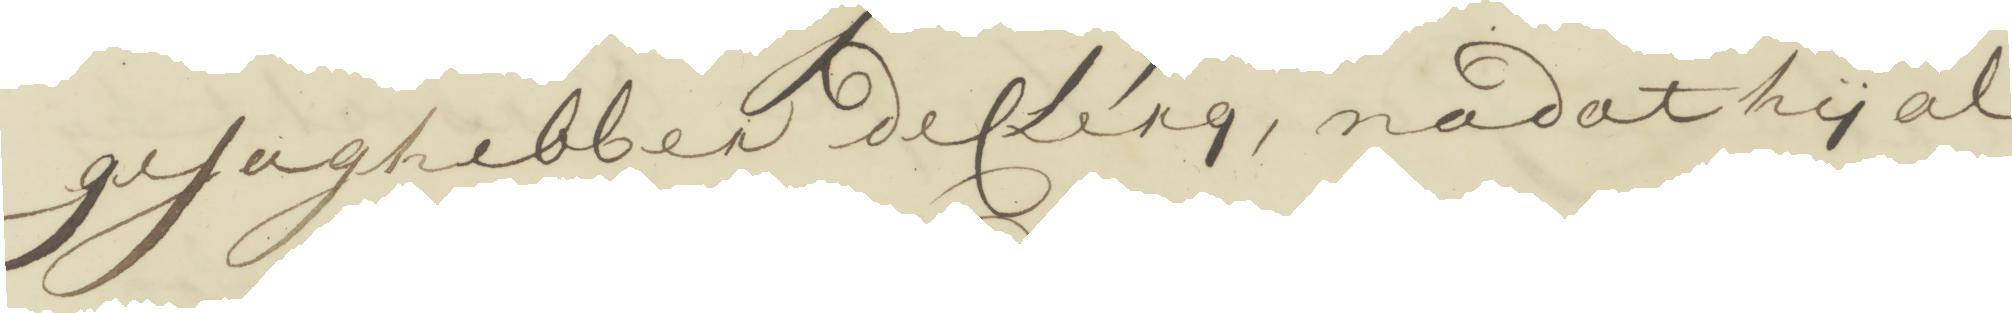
gesaghebber de Clerq, nadat hij al
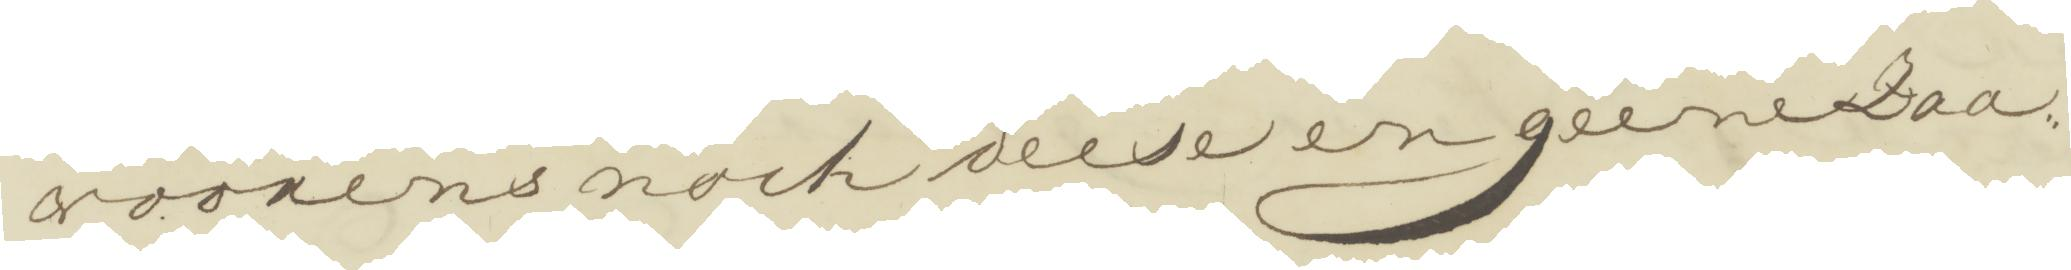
voorens noch deese den gene zaa„
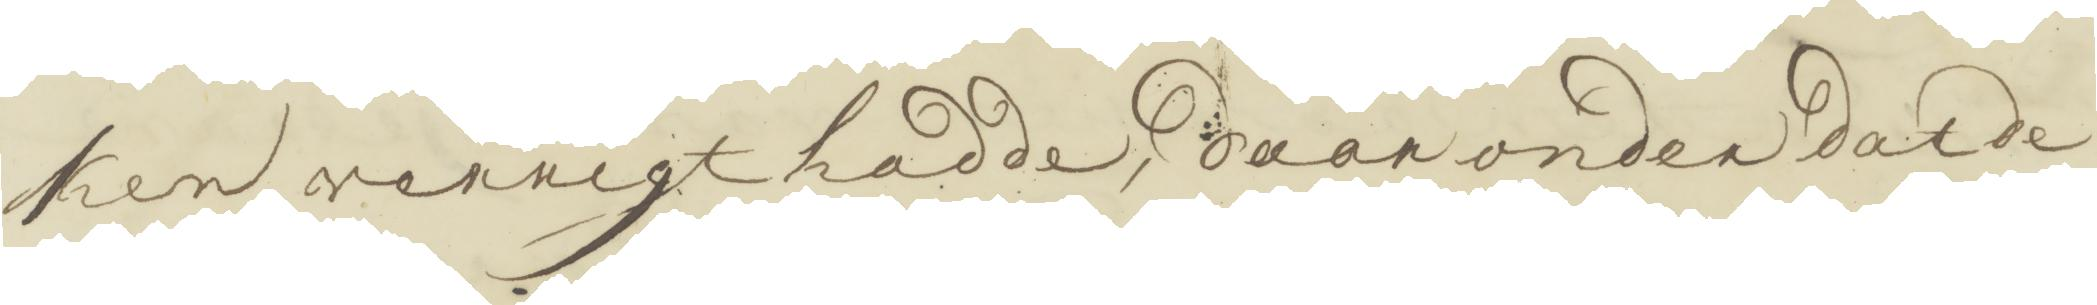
ken verrigt hadde, daar onder dat de
